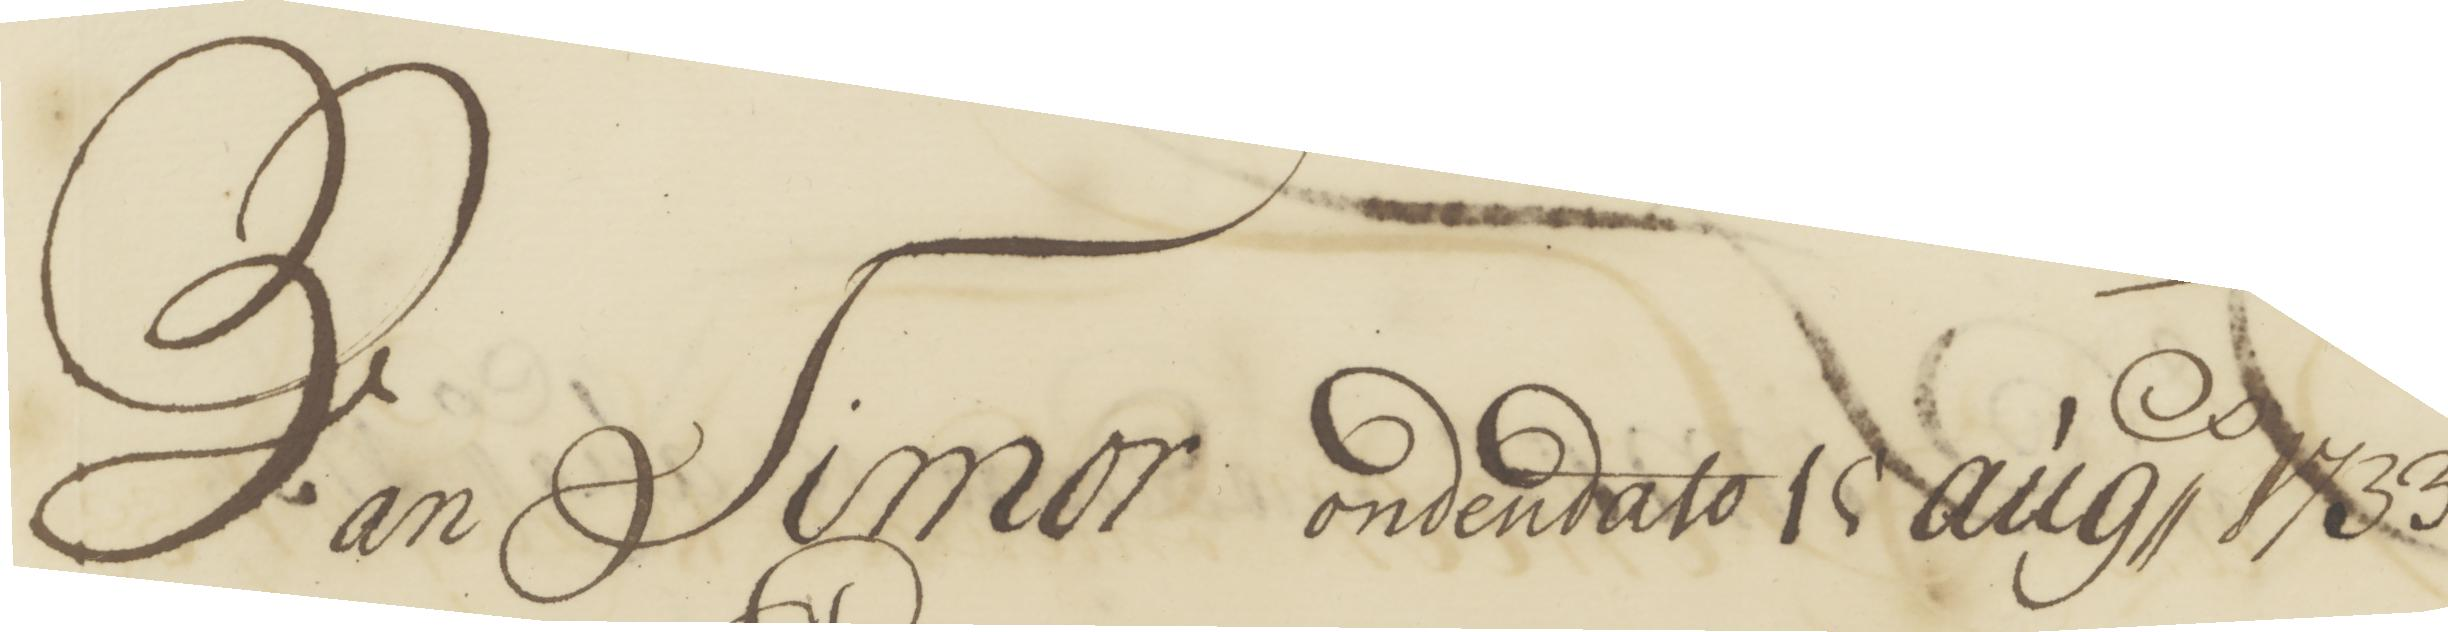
Van Timor onder dato 15 aug„s 1733
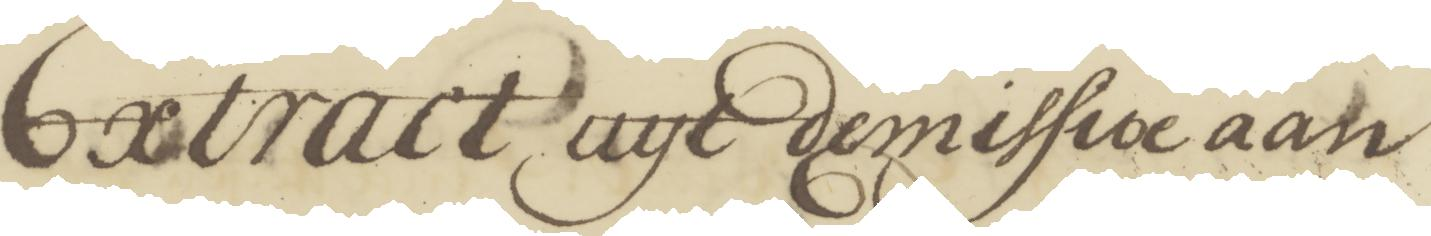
Extract uyt demissive aan
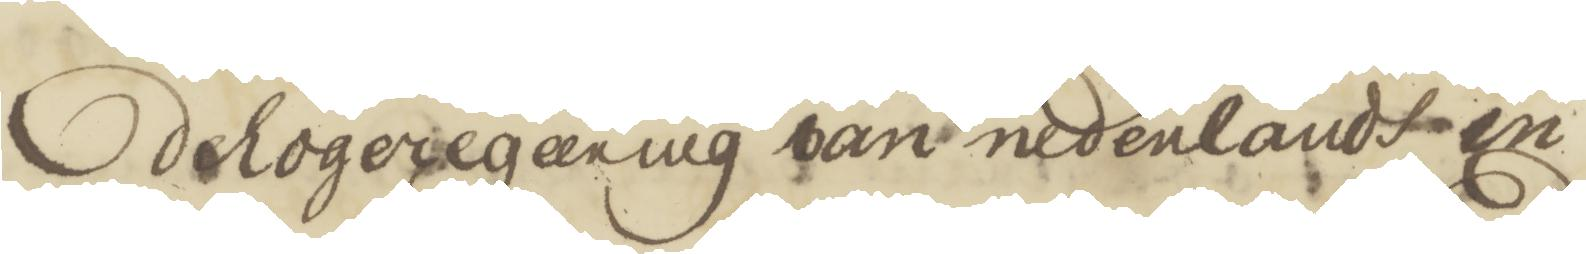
de hogeregeering van nederlands in
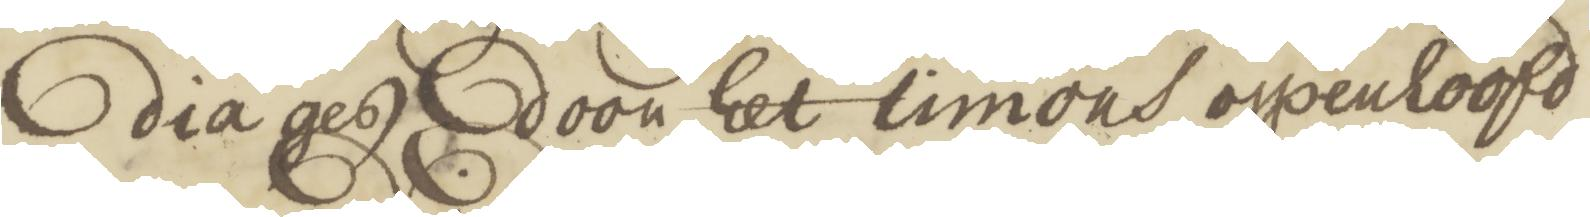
dia gesz door het timors opperhoofd
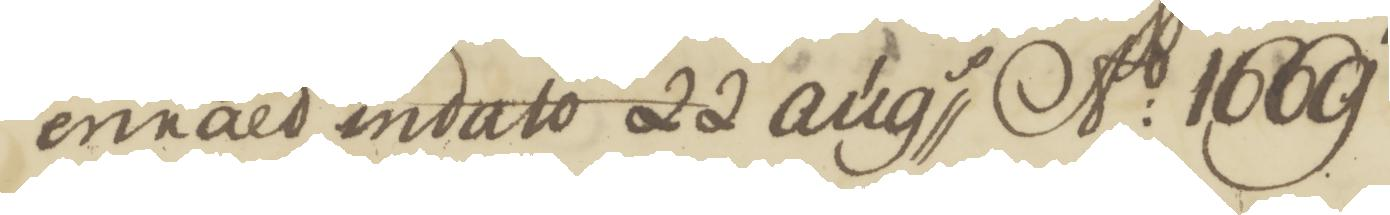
enraed indato 22 aug„s A:o 1669
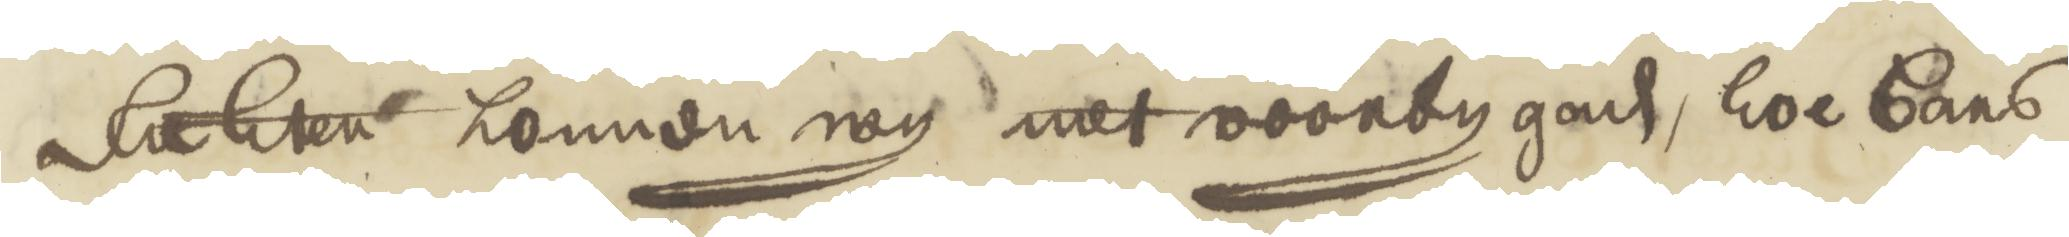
Echter konnen wy niet voorby gaen, hoe bars
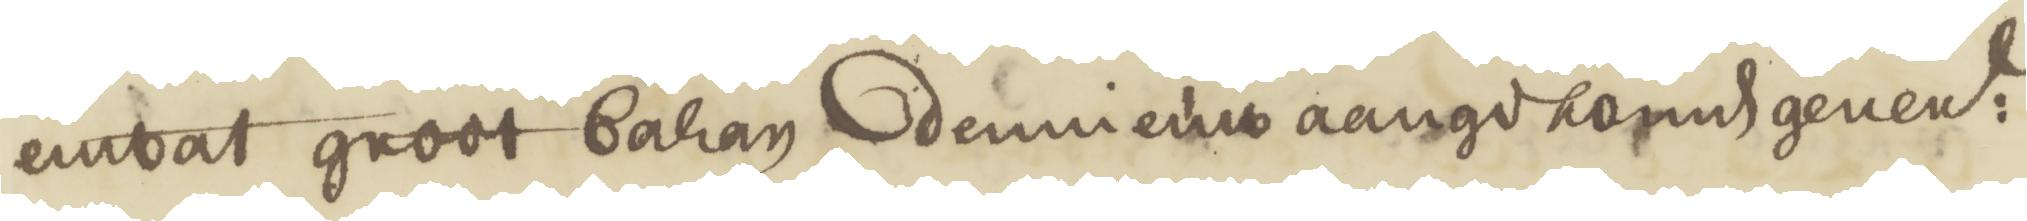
enwat groot bahay dennieuw aangekomen gener:l
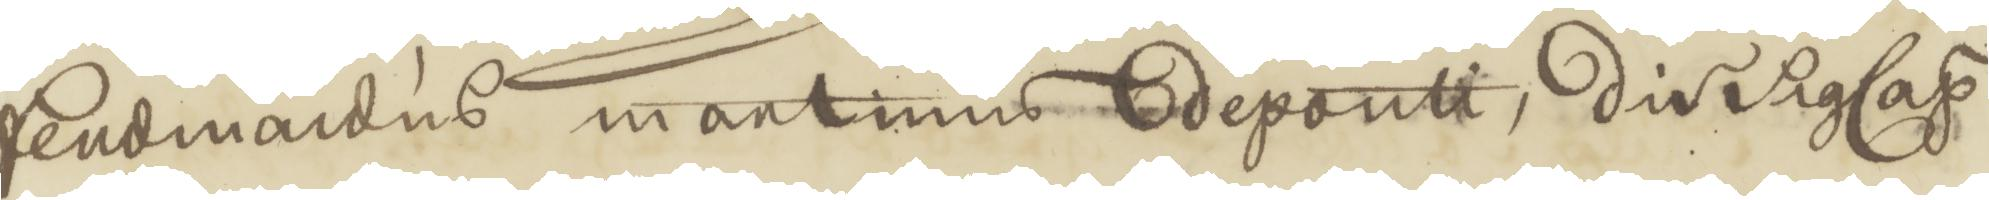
ferdinandus martinus deponti, die sig Cap
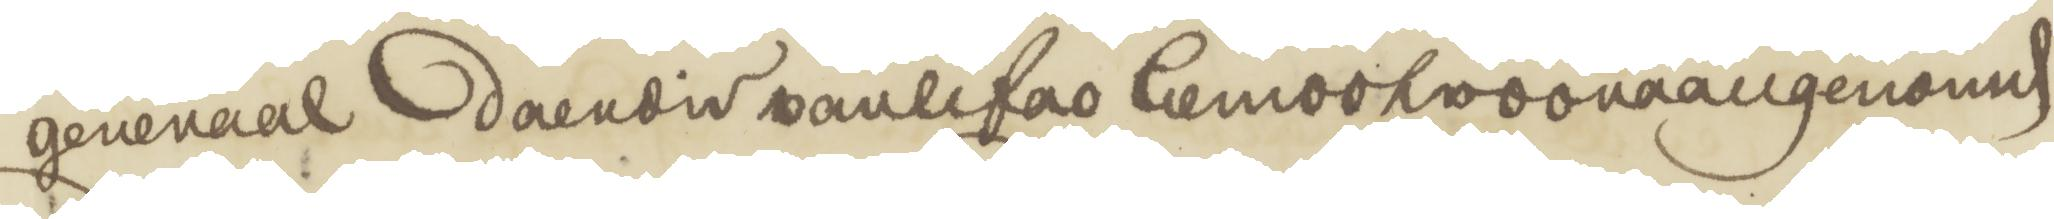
generaal daerdie vanlifao hemookvooraangenomen
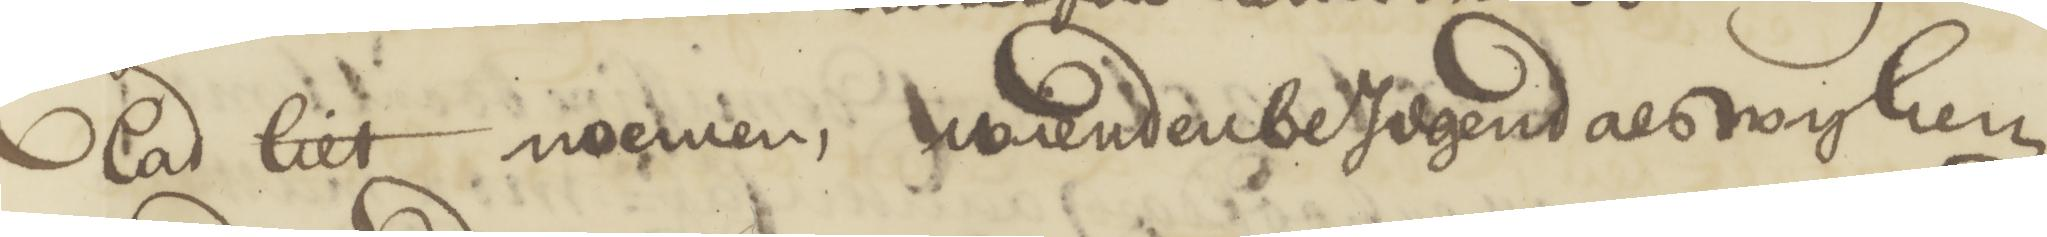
had liet noemen, wierdenbejegend alswyhem
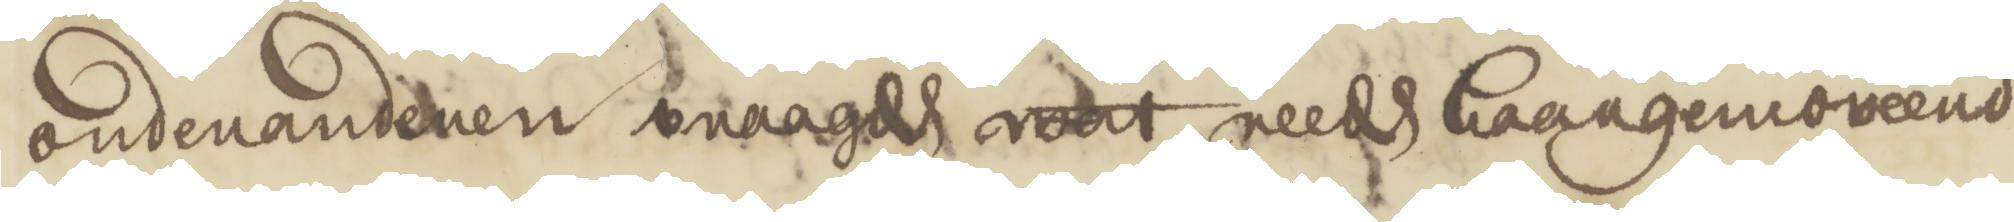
onderanderen vraagden wat reeden haargemoveerd
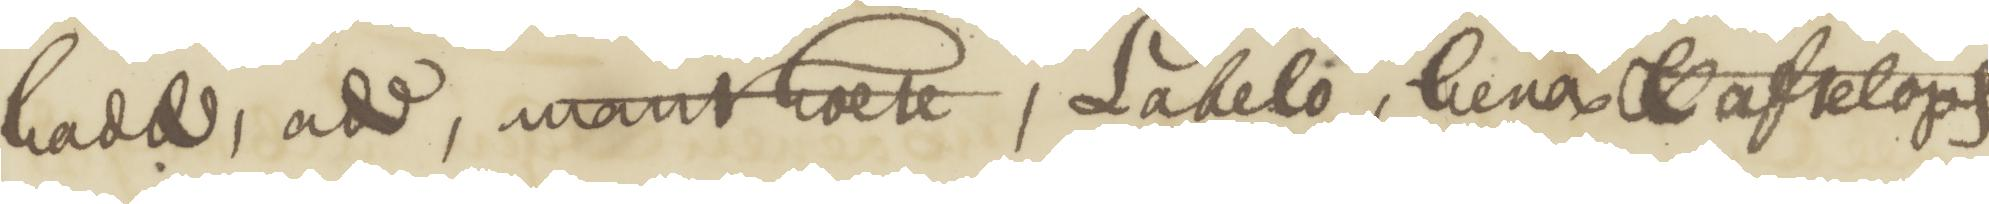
hadde, ade, manthoete, Labelo, hera & aftelopen
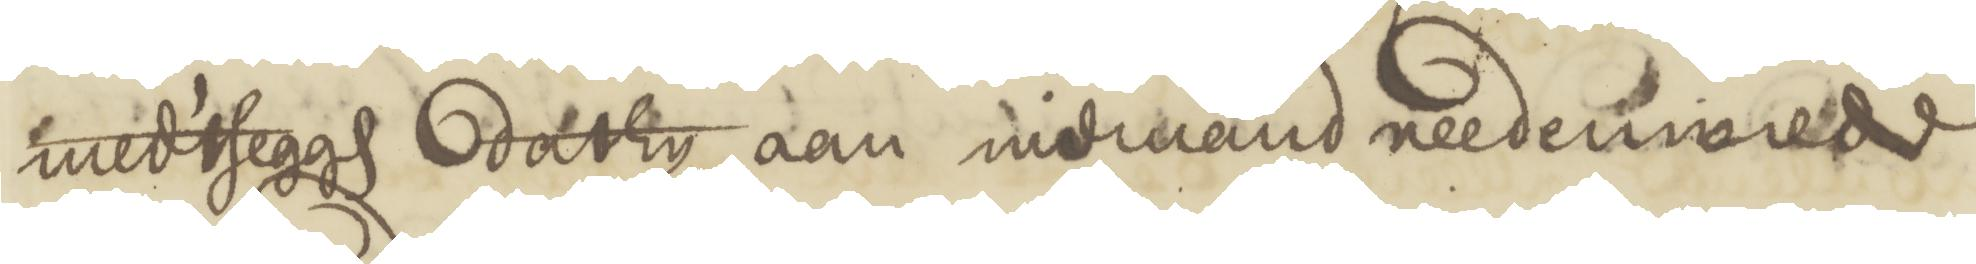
med'tseggen dathy aan niemand reedenwilde
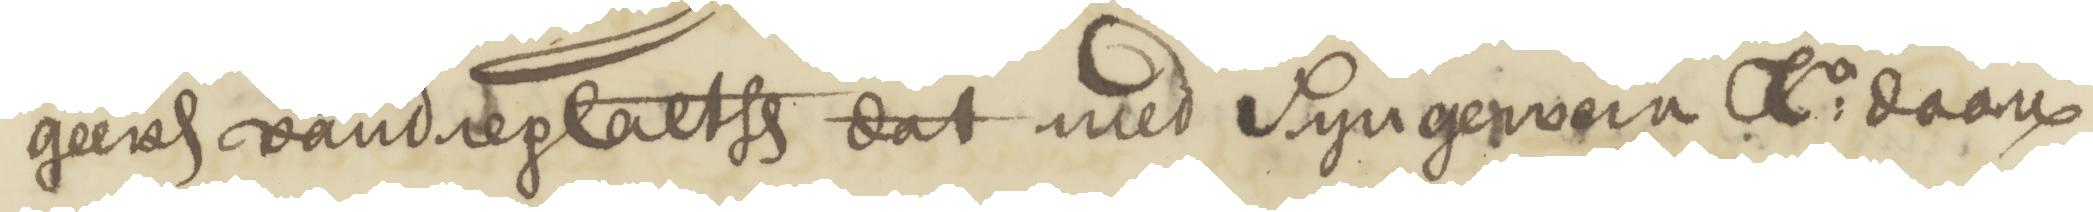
geeven vandieplaetsen dat med syn geweir Et:a daar
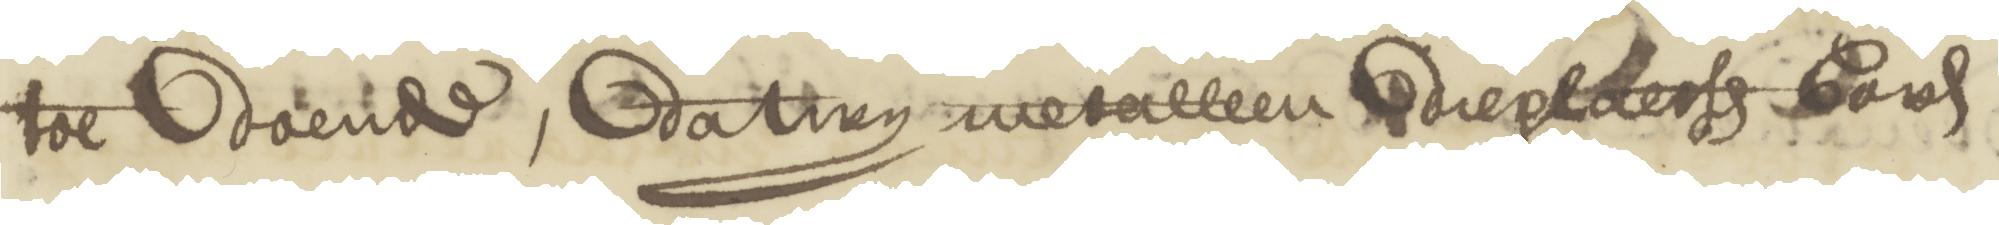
toe doende, datwy metalleen dieplaetsen boven
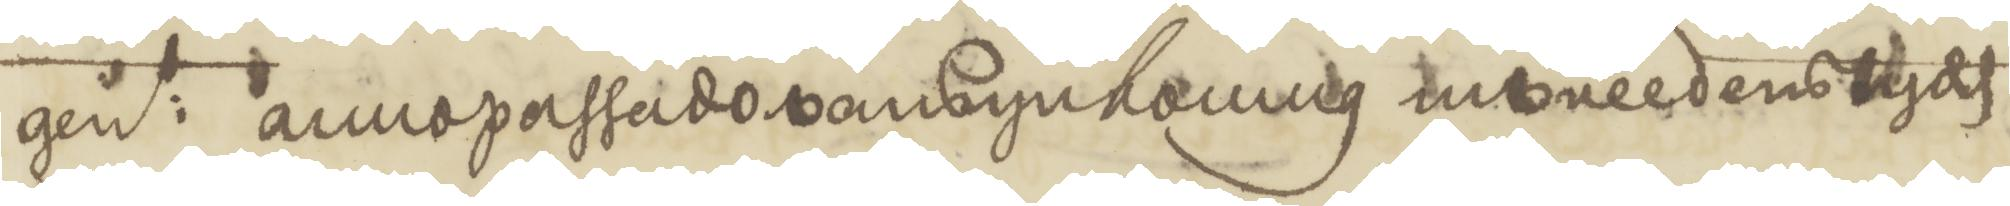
gen:t annopassado vansynkoning invreedenstyden
